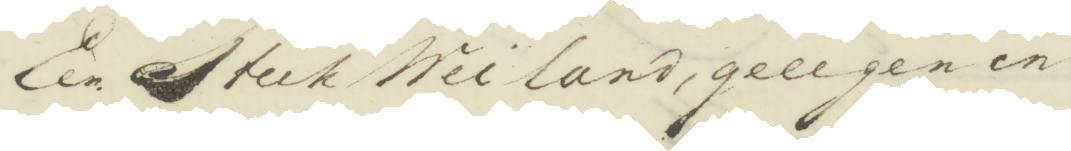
Een Stuk Weiland, gelegen in
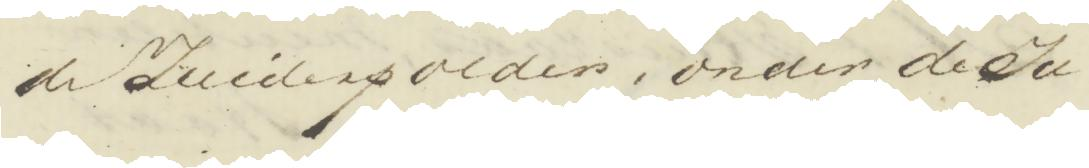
de Zuiderpolder, onder de Iu
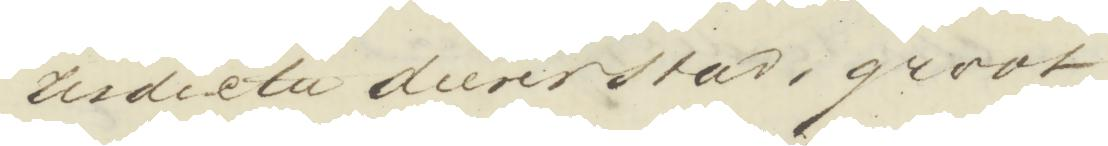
risdictie deeser stad, groot
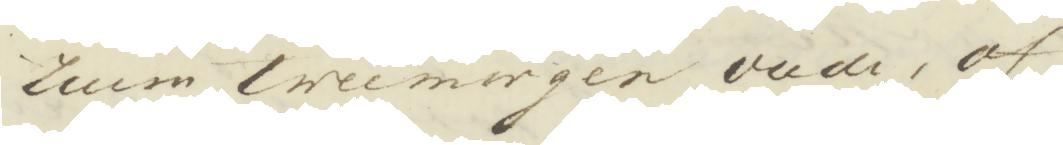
ruim twee morgen oude, of
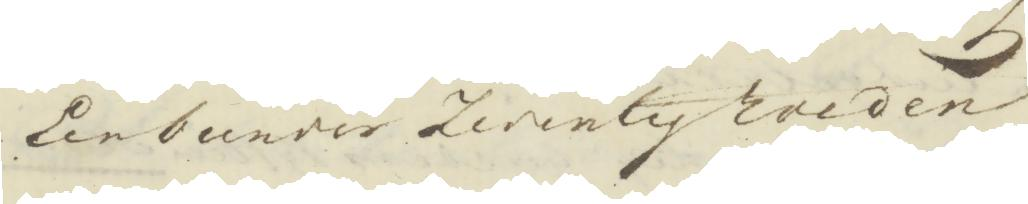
Een bunder zeventig roeden
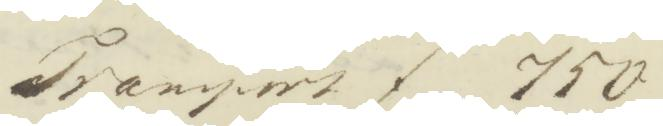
Transport ƒ 750
